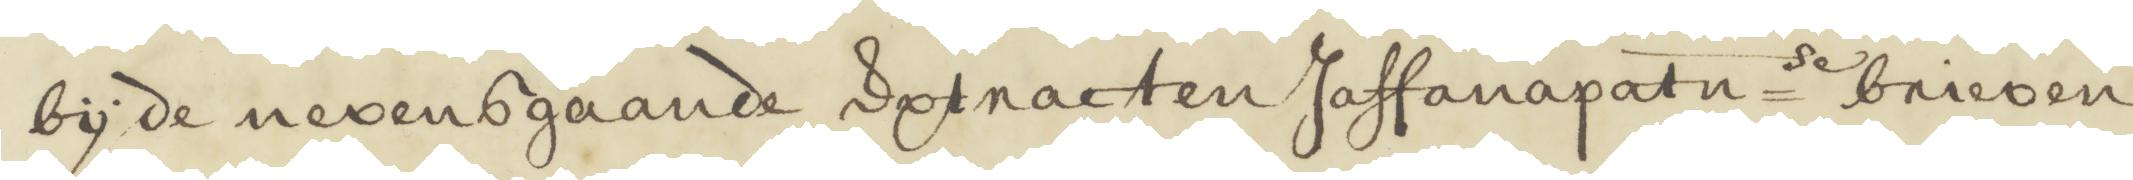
bij de nevensgaande Extracten Jaffanapatn=se brieven
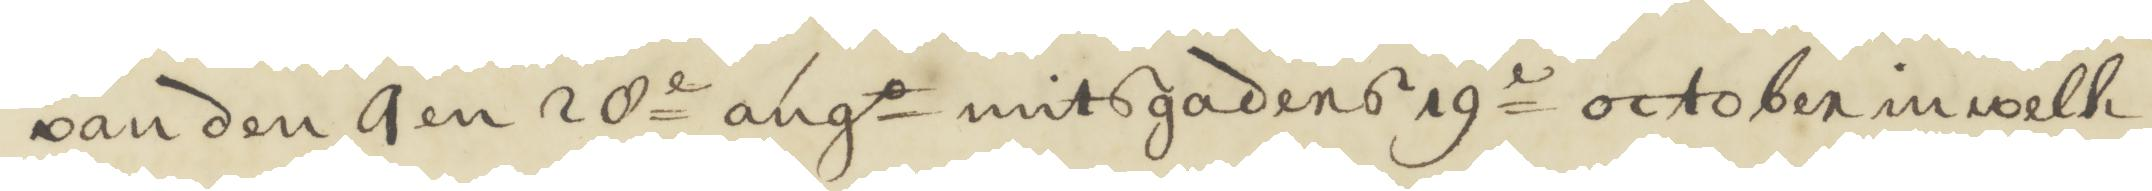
van den 4 en 28=e aug=o mitsgaders 19=e october in welk
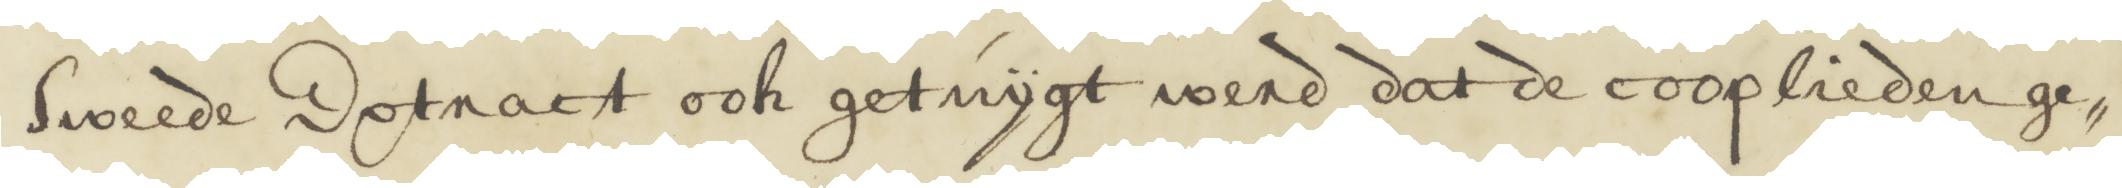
tweede Extract ook getuijgt werd dat de cooplieden ge„
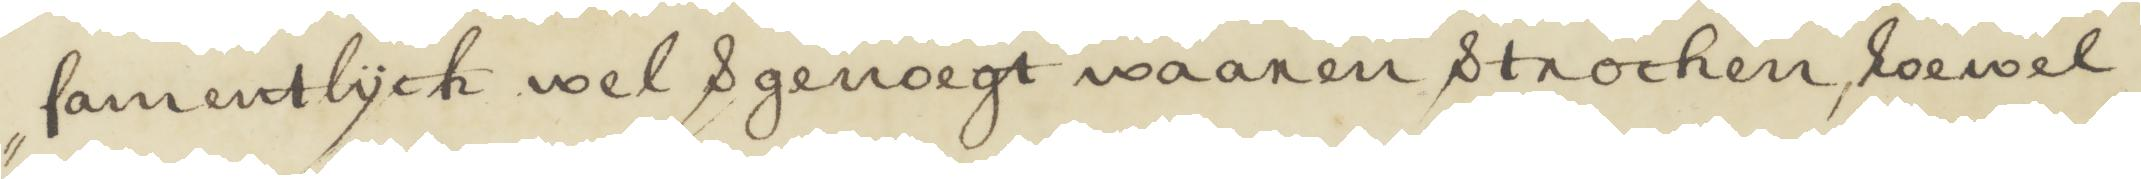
„samentlijck wel vergenoegt waaren vertrocken, hoewel
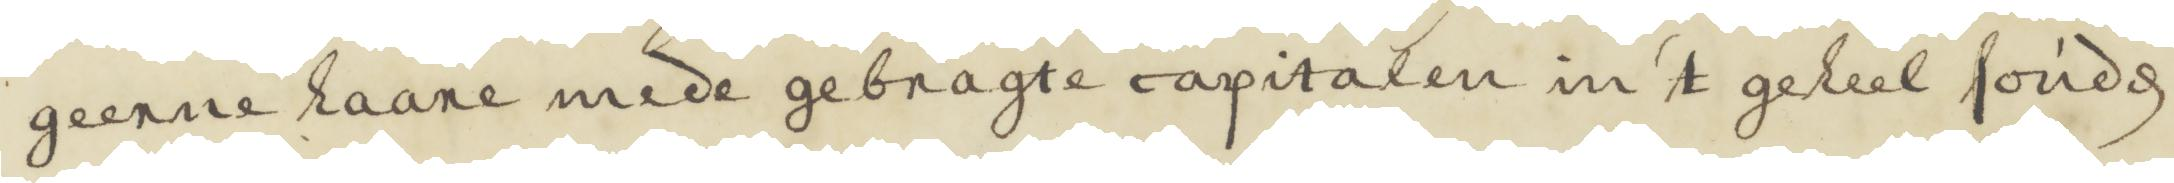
geerne haare mede gebragte capitalen in ’t geheel souden
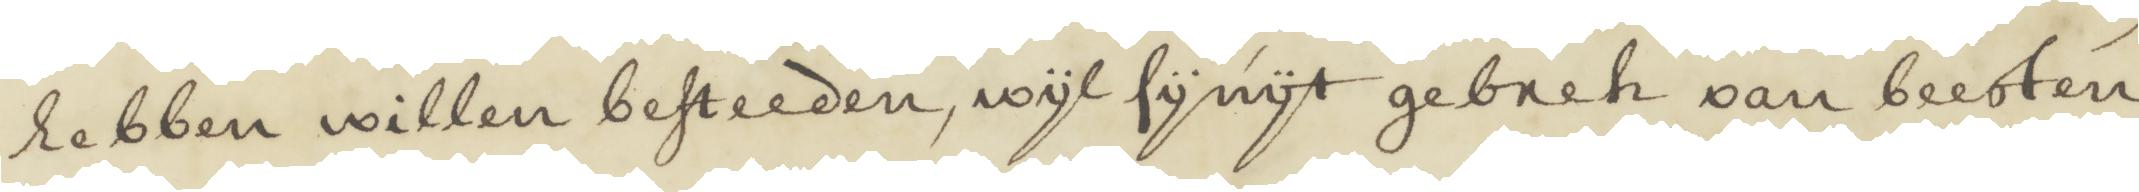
hebben willen besteeden, wijl sij uijt gebrek van beesten
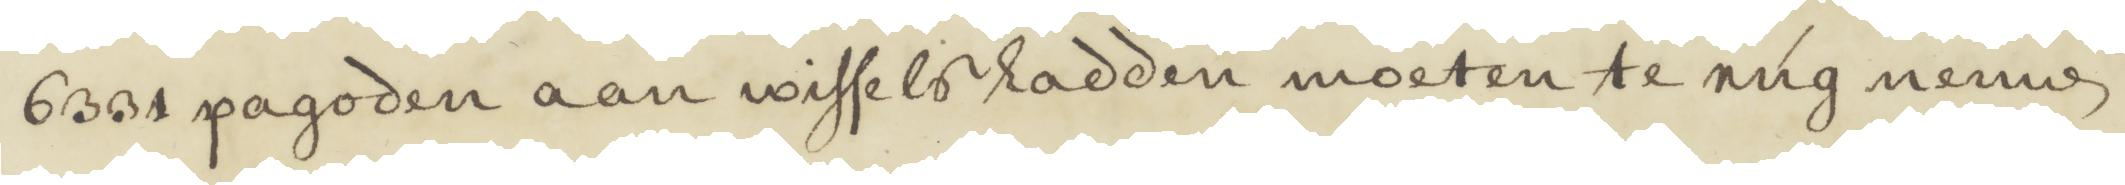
6331 pagoden aan wissels hadden moeten te rug nemen
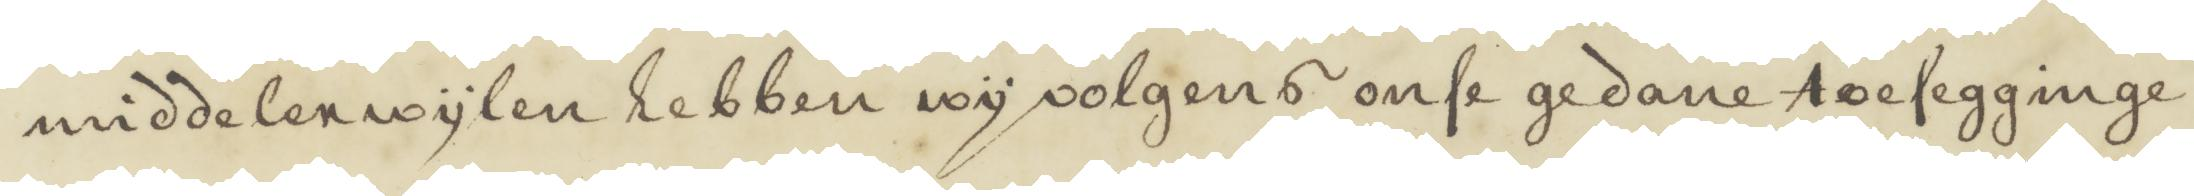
middelerwijlen hebben wij volgens onse gedane toesegginge
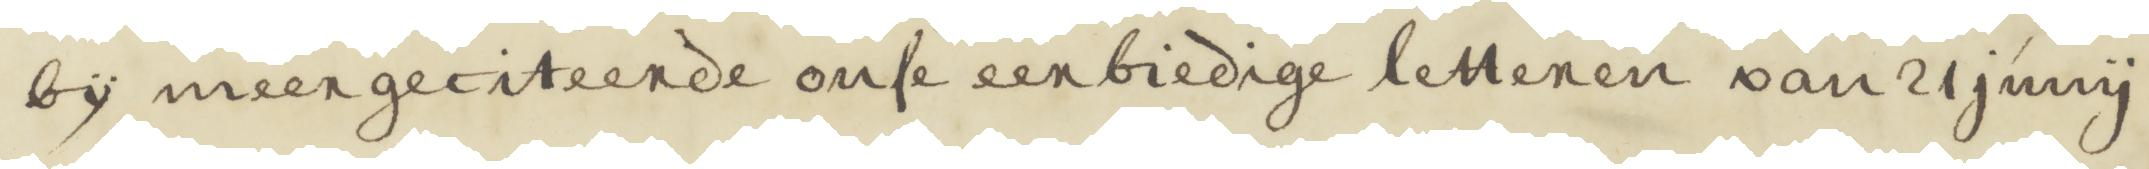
bij meer geciteerde onse eerbiedige letteren van 21 junij
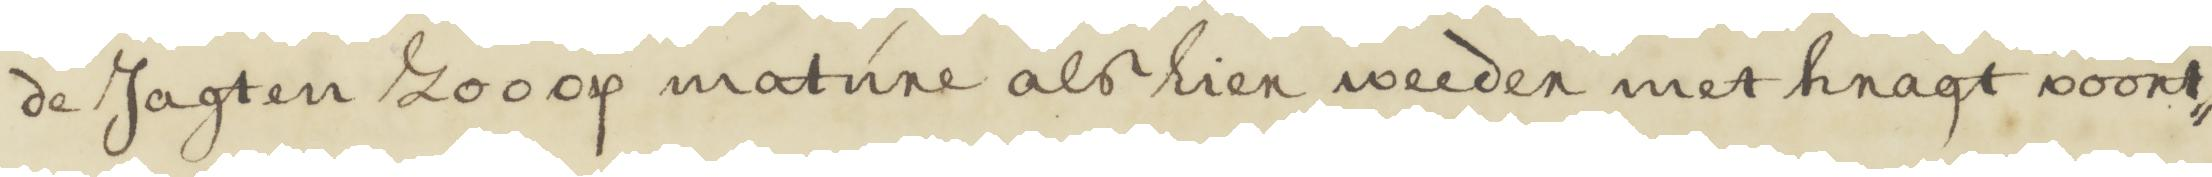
de Jagten zoo op mature als hier weeder met kragt voort„
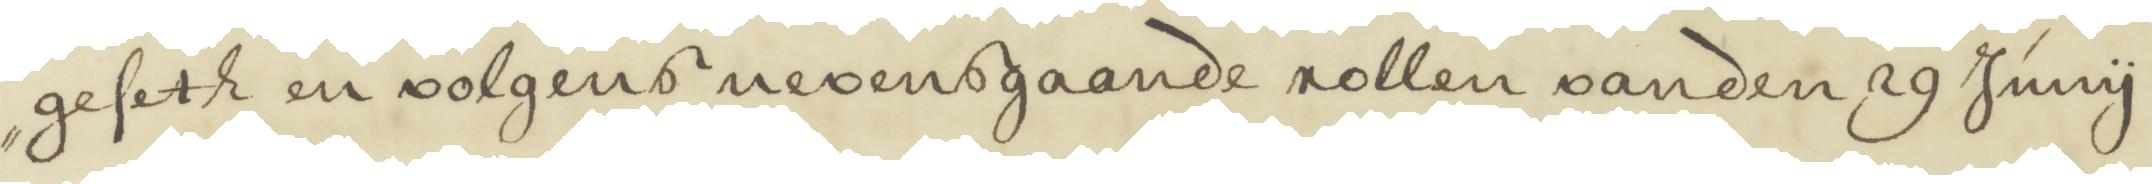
„geseth en volgens nevensgaande rollen vanden 29 Junij
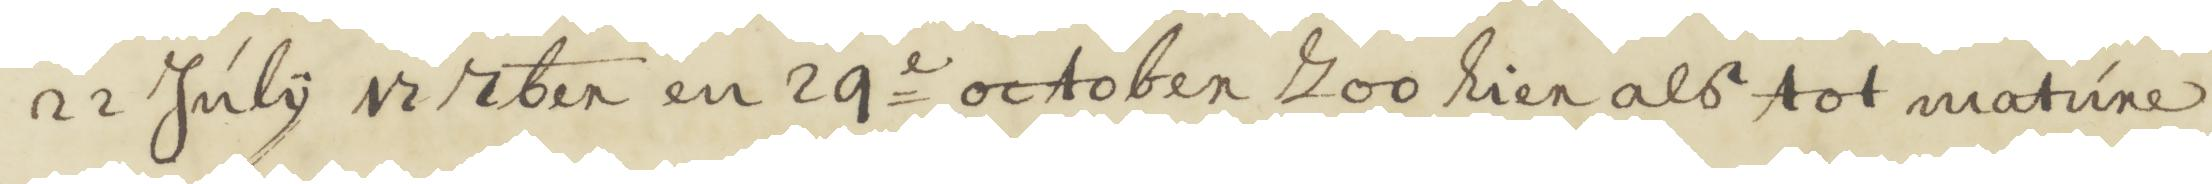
22 Julij 17 7ber en 29=e october zoo hier als tot mature
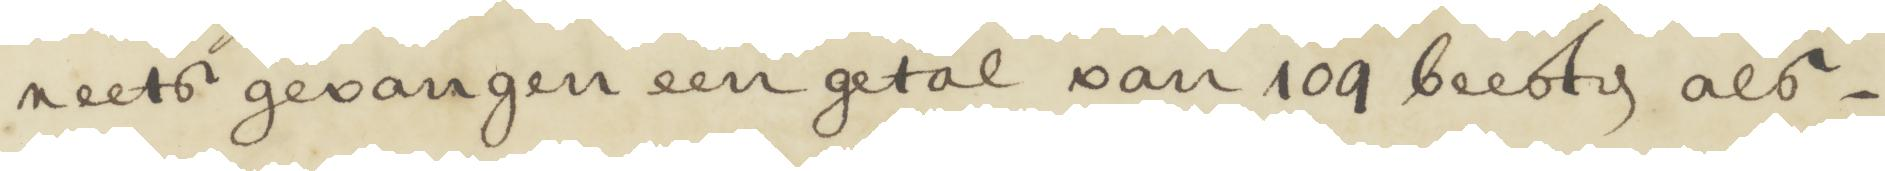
reets gevangen een getal van 104 beesten als_
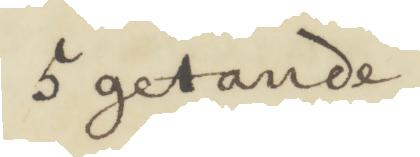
5 getande
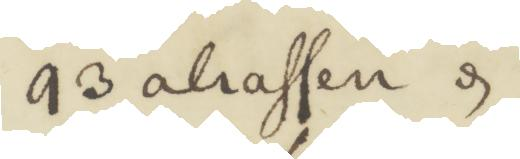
43 alrassen en
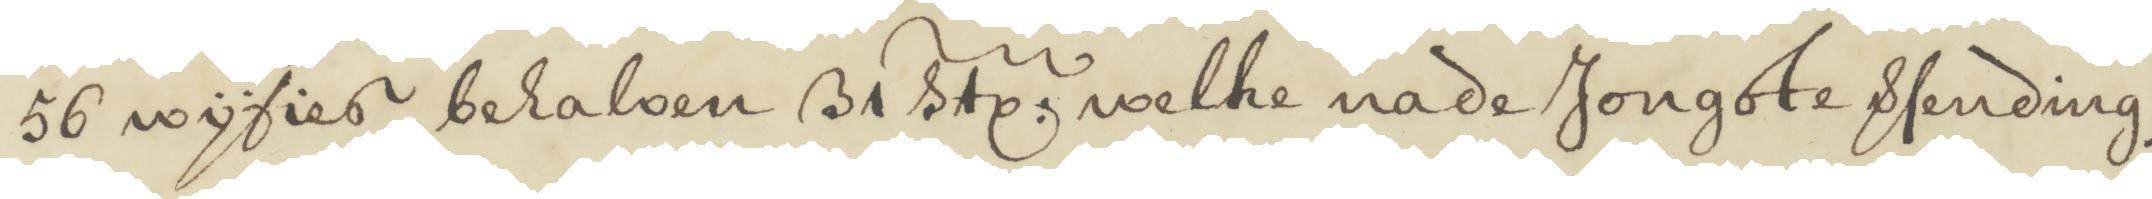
56 wijfies, behalven 31 stx: welke na de Jongste versending
